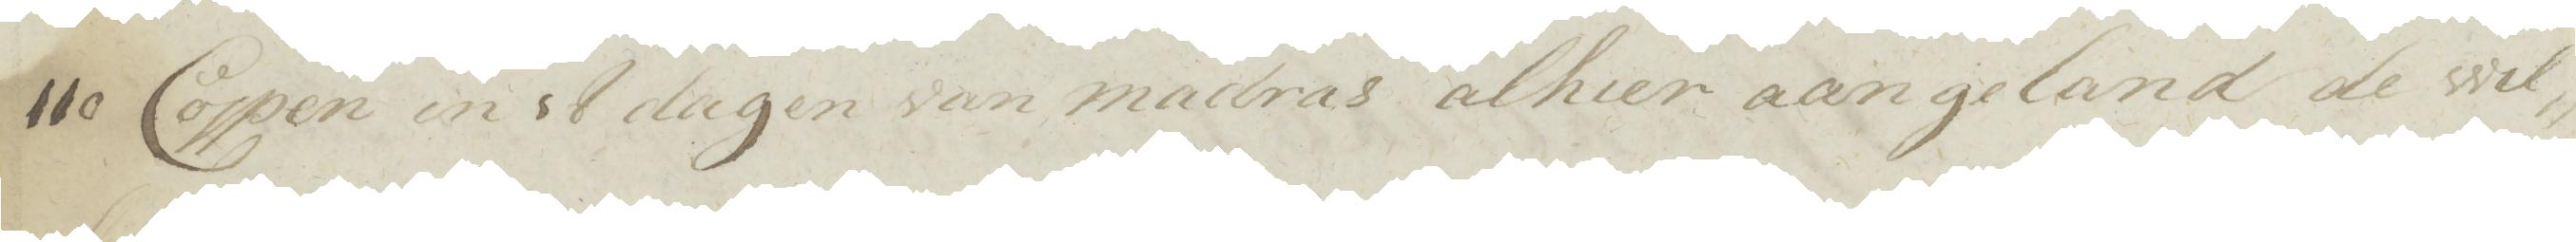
110 Coppen en 18 dagen van madras alhier aan geland de wil„
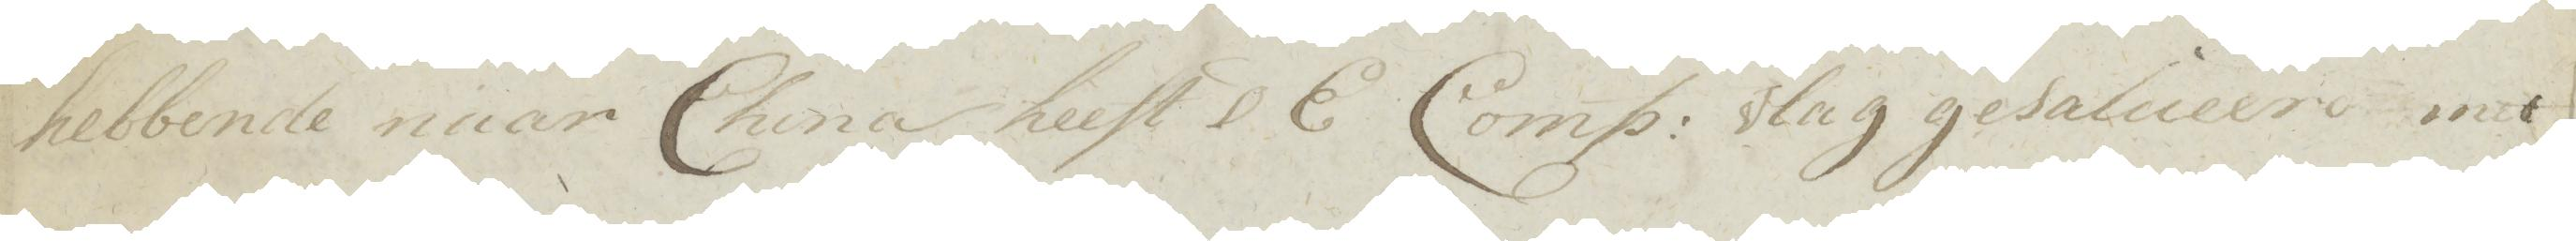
hebbende naar China heeft d E Comp: vlag gesalueerd met
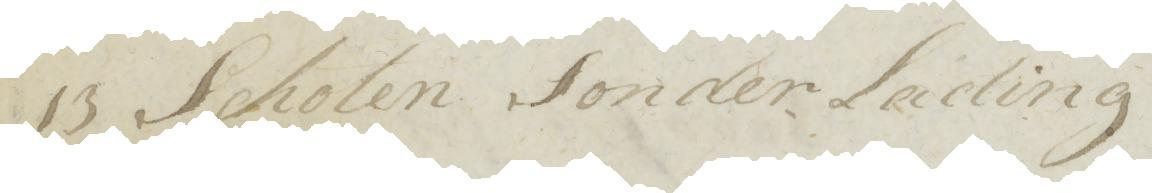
13 schoten sonder lading
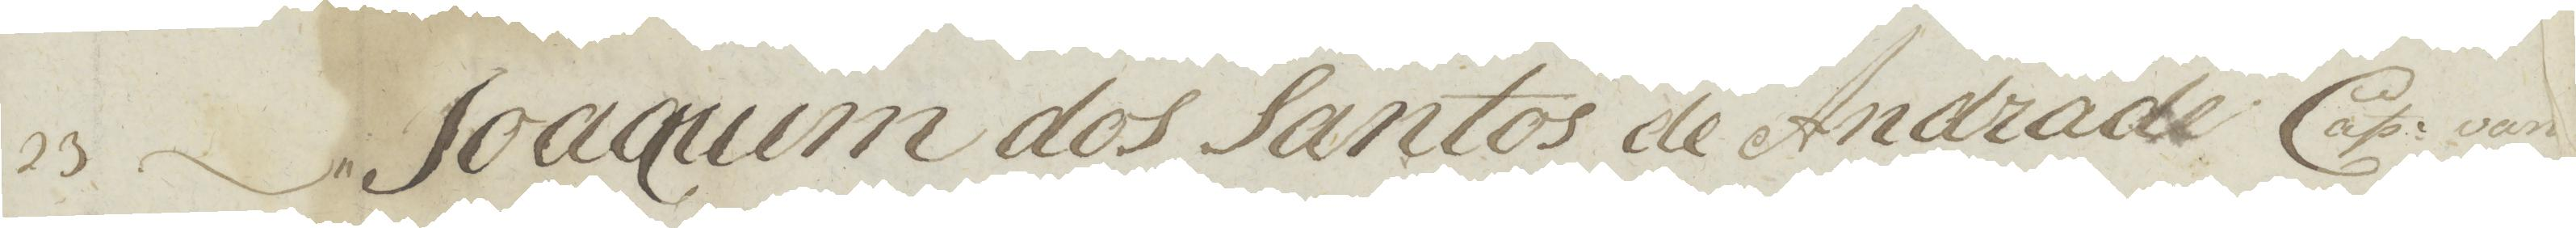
23 — „ Joaquim dos Santos de Andrade Cap: van
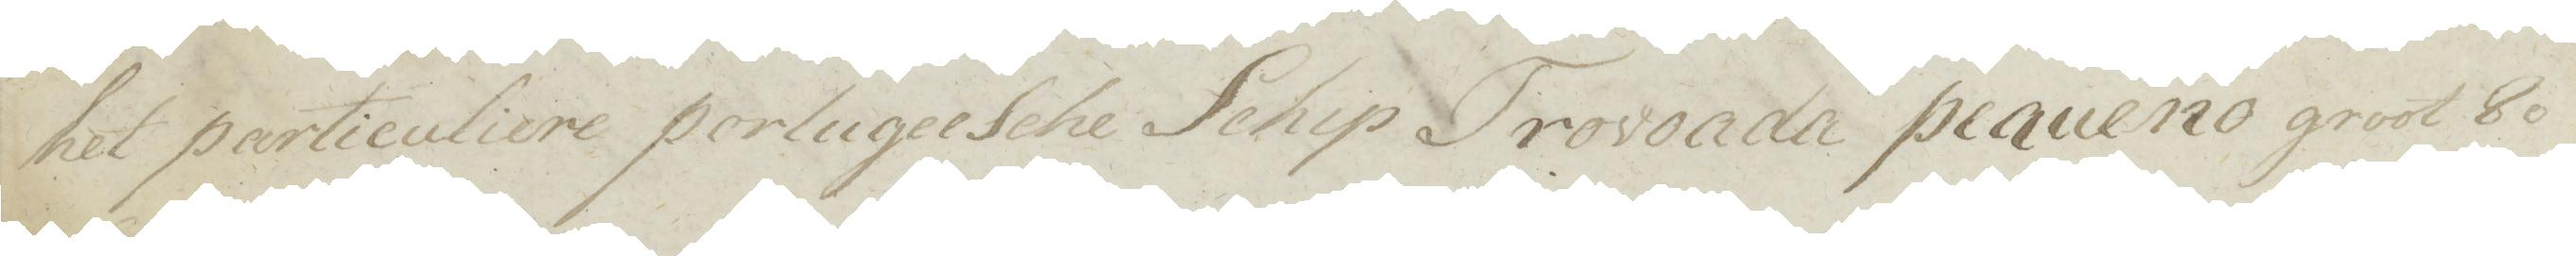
het particuliere portugeesche schip Trovoada pequeno groot 80
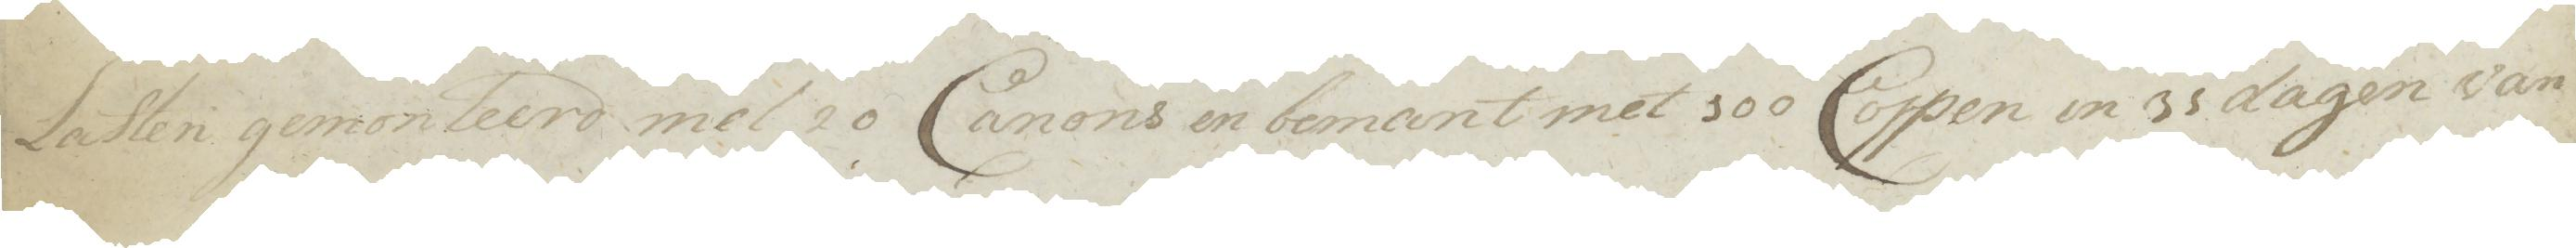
lasten gemonteerd mel 20 Canons en bemant met 100 Coppen en 31 dagen van
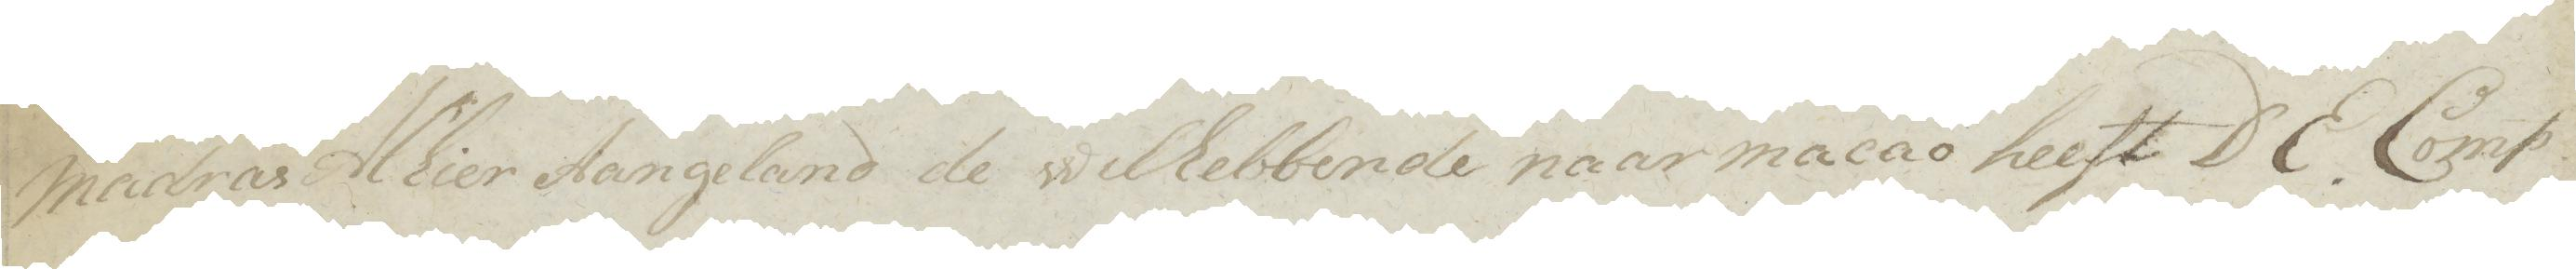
madras Alhier Aangeland de wilhebbende naar macao heeft D E. Comp:
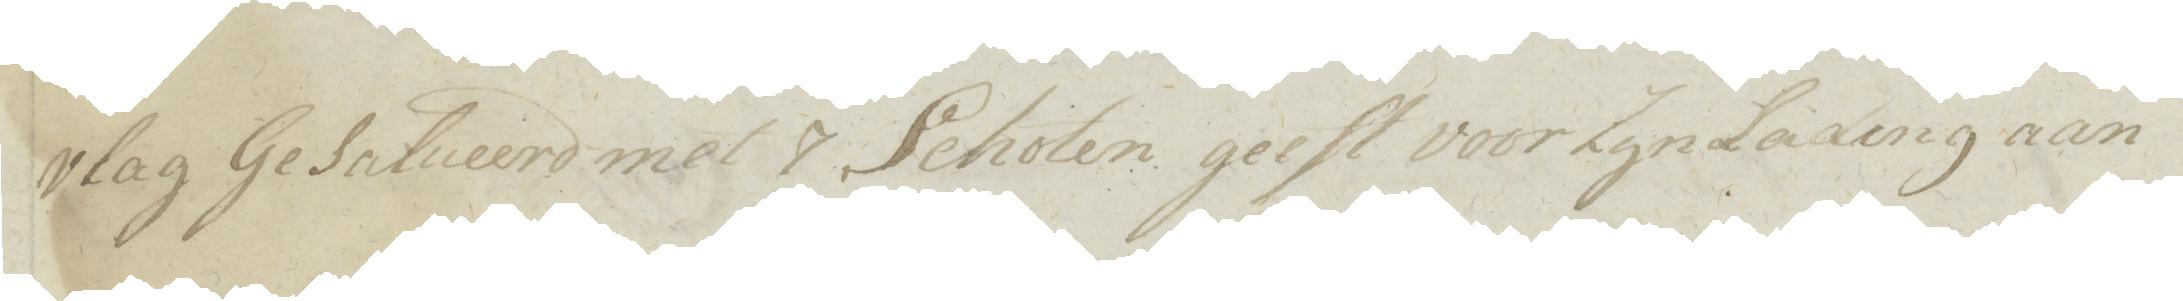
vlag gesalueerd met 7 schoten geeft voor zyn Lading aan
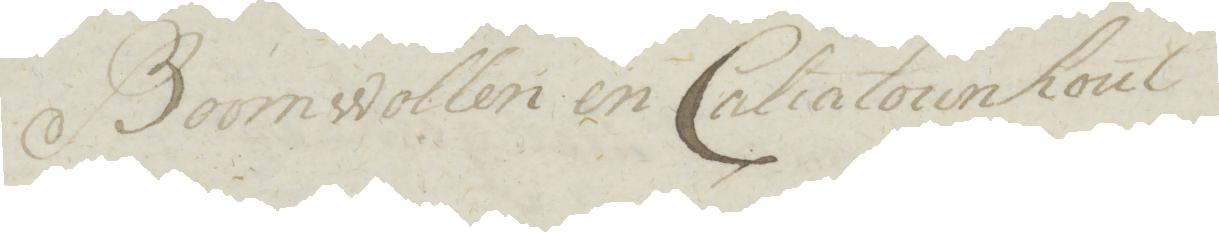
Boom wollen en Caliatounhout
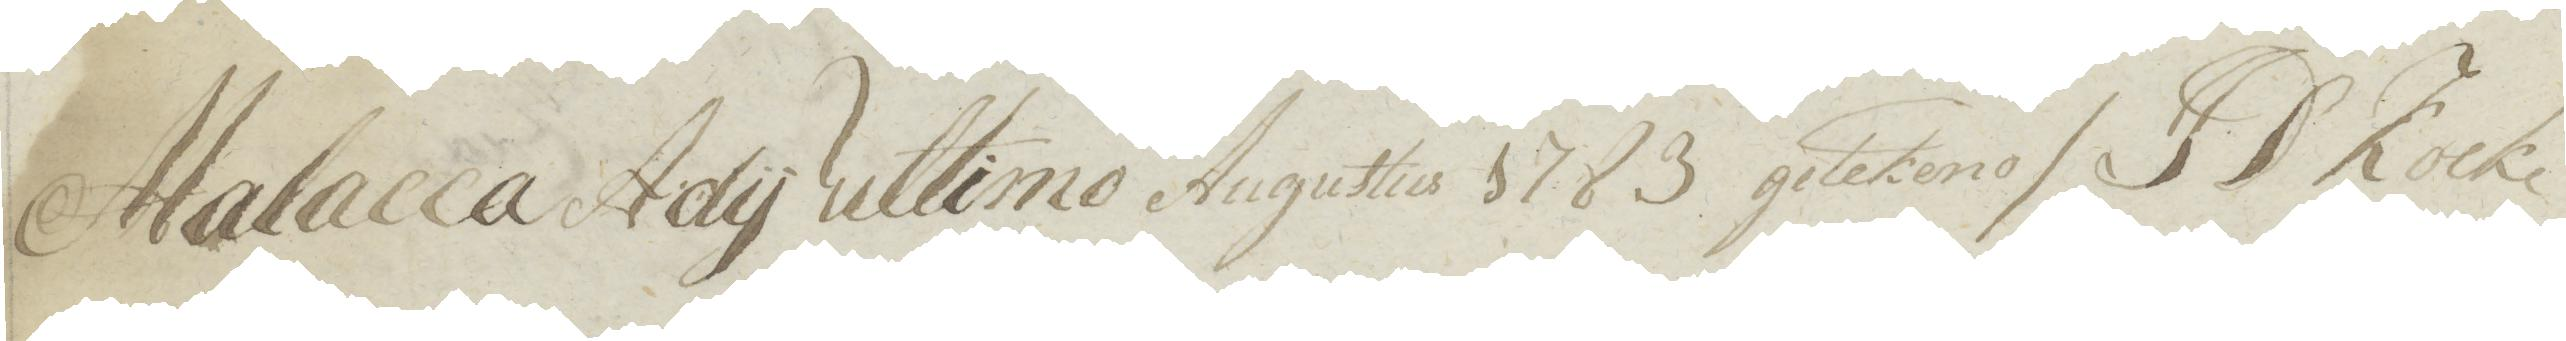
Malacca Adij ultimo Augustus 1783 gelekend/ J D Koek
